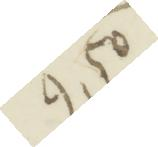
9,50
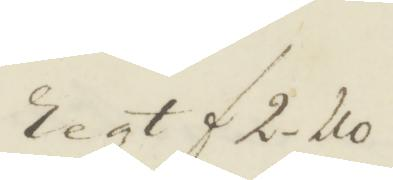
regt ƒ 2-40
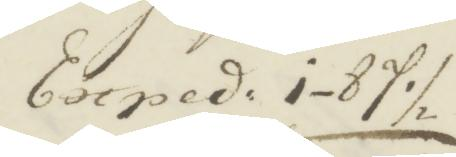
Exped„ 1-87½
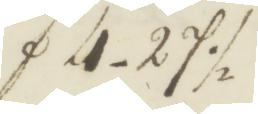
ƒ 4-27½
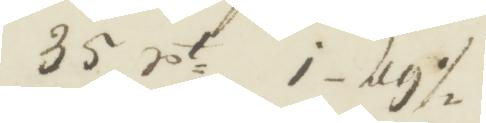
35 p=t 1 - 49½
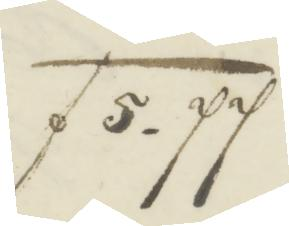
ƒ 5- 77
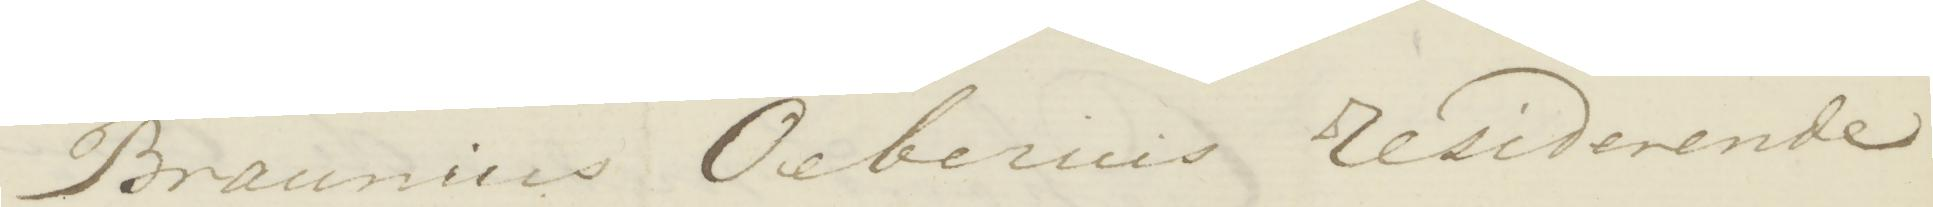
Braunius Oeberuis residerende
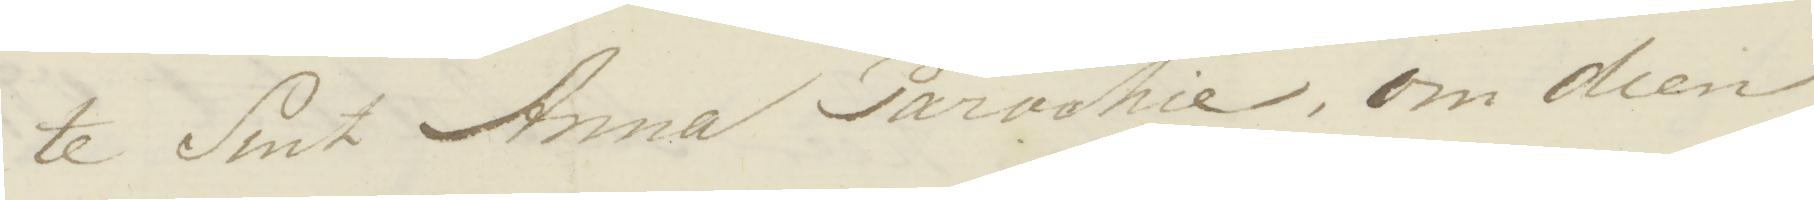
te Sint Anna Parochie, om dien
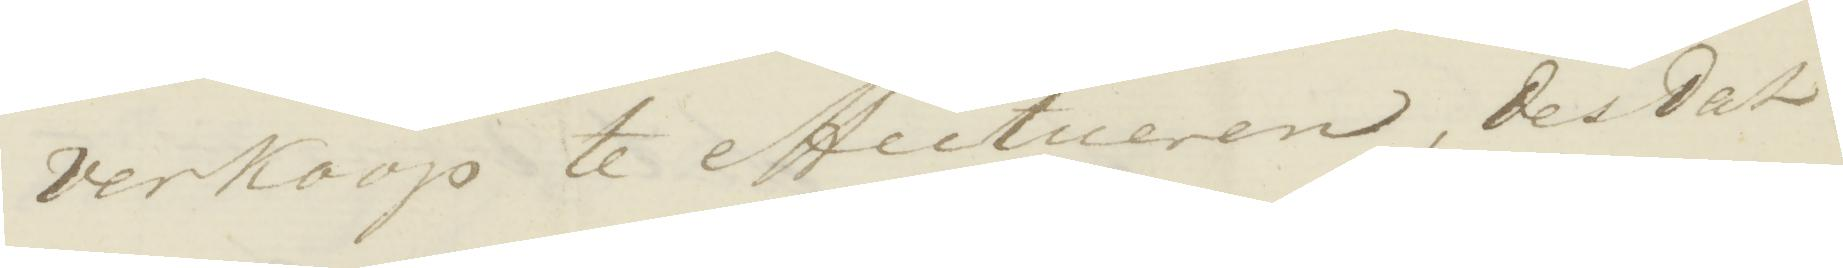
verkoop te effectueren, des dat
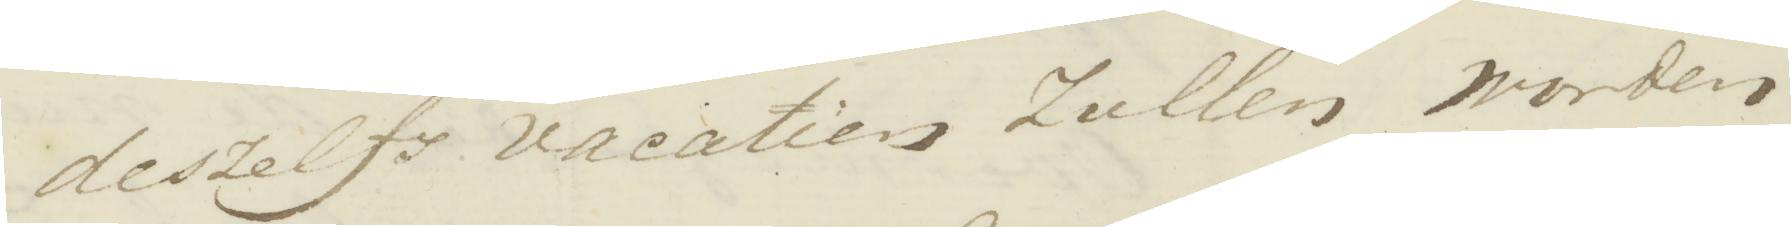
deszelfs vacatien zullen worden
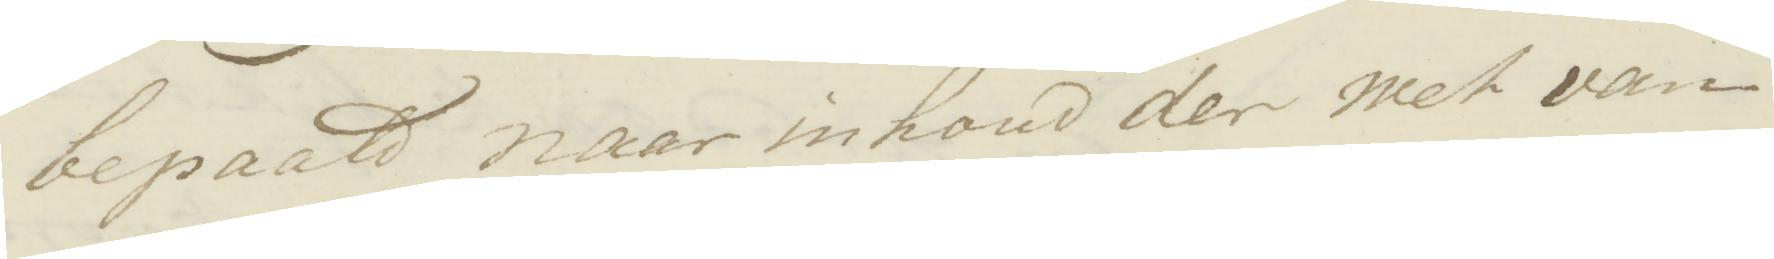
bepaald naar inhoud der wet van
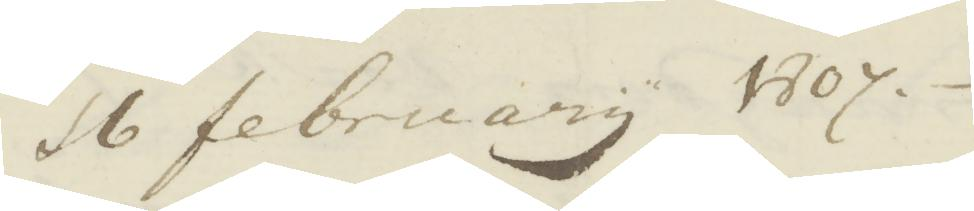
16 februarij 1807. —
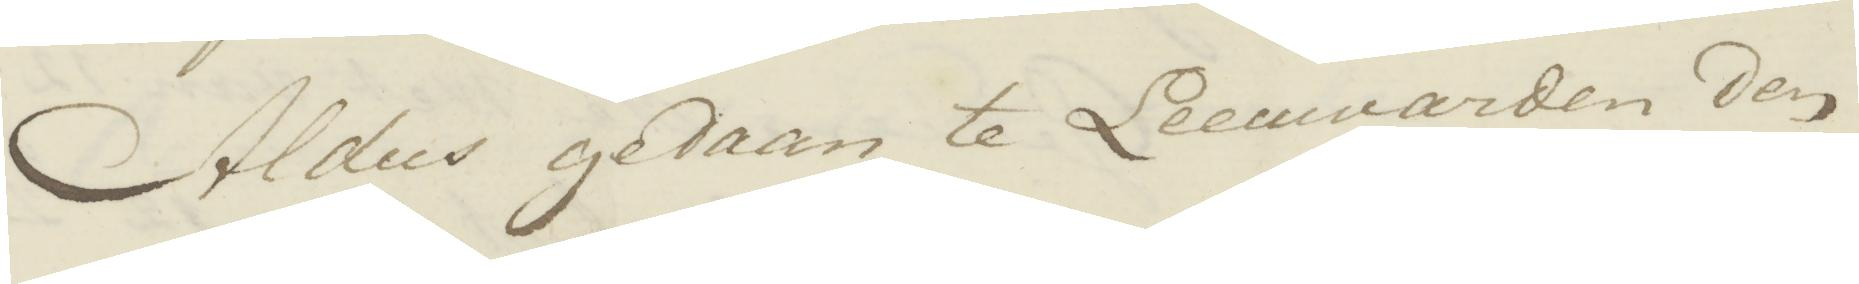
Aldus gedaan te Leeuwarden den
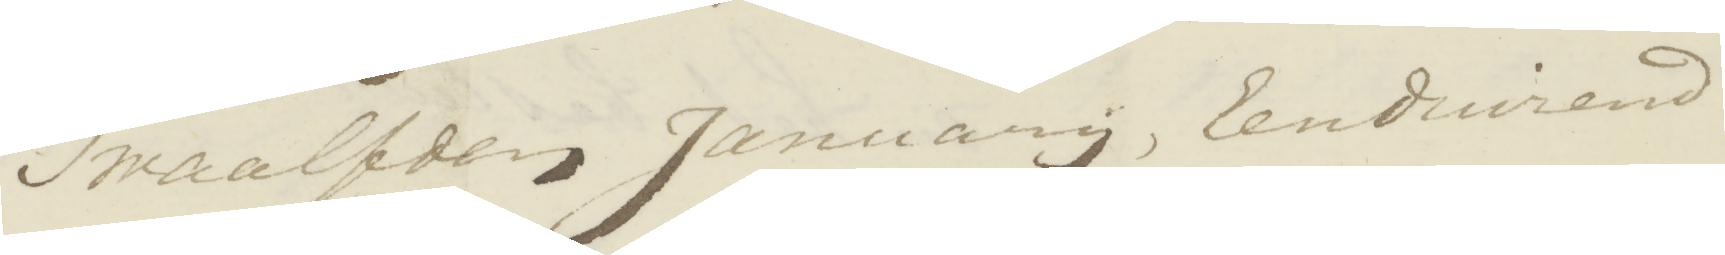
Twaalfden Januarij, Een duizend
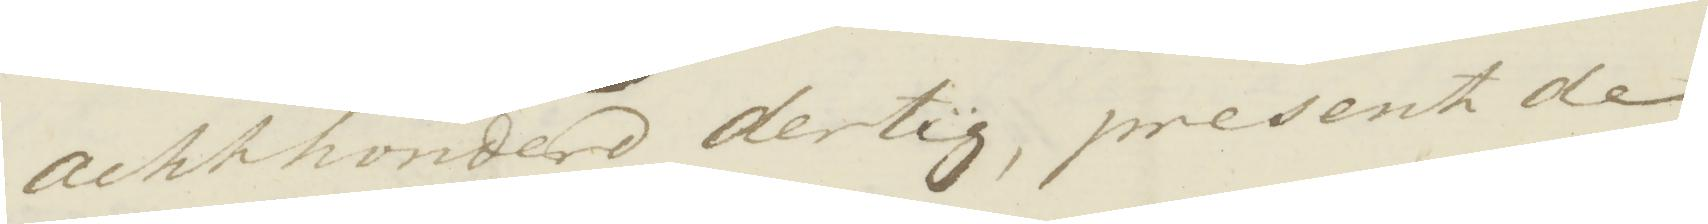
achthonderd dertig, present de
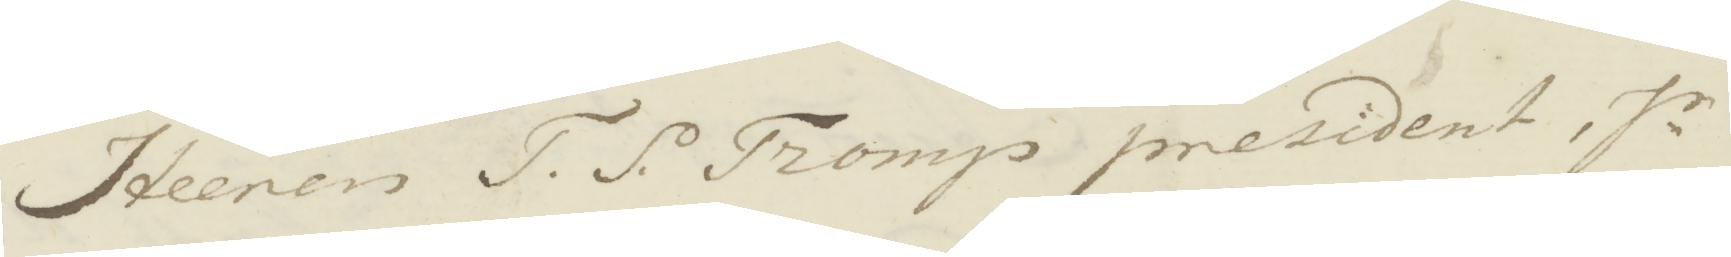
Heeren T. P. Tromp president, p„r
